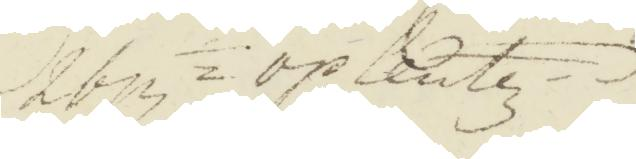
26 /c=t opCenten -
